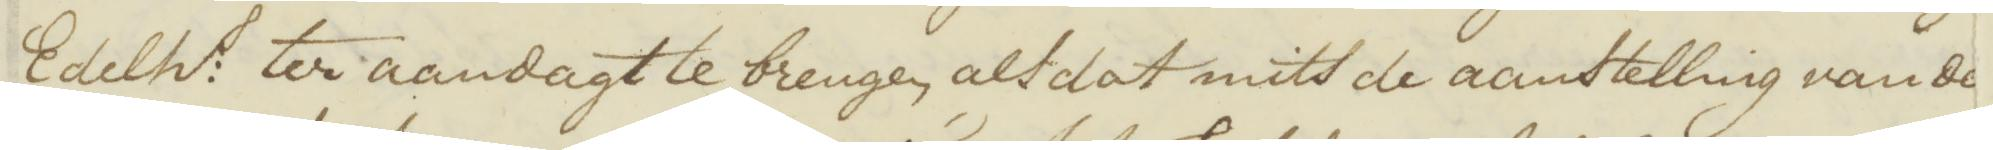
Edelh:s ter aandagt te brengen als dat mits de aanstelling van de
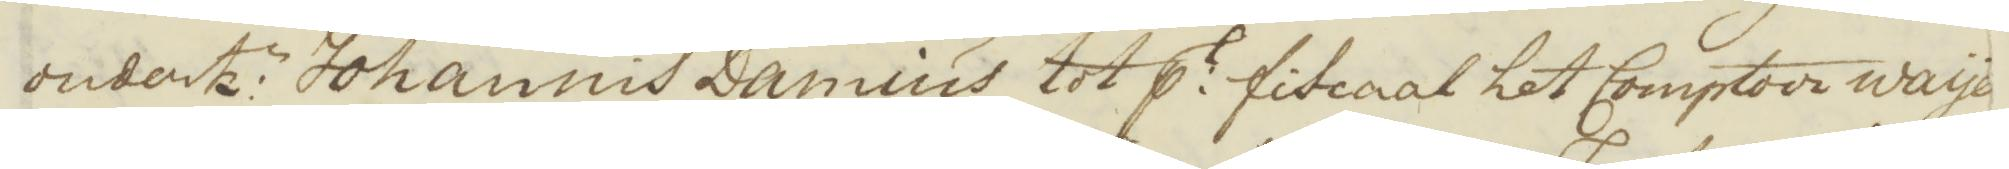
onderk:n Iohannis Damius tot p:l fiscaal het Comptoir waij
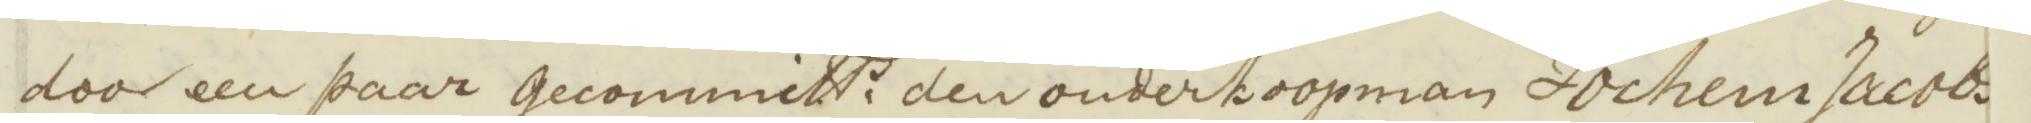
door een paar gecommitt:s den onderkoopman Iochem Jacob
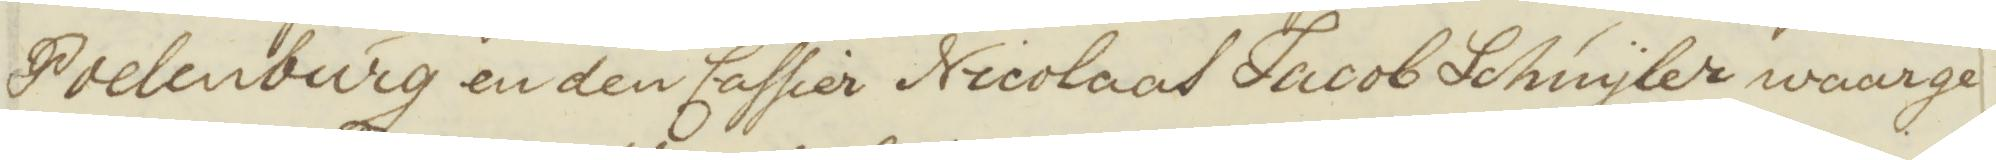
Poelenburg en den Cassier Nicolaas Iacob Schuijler waarge
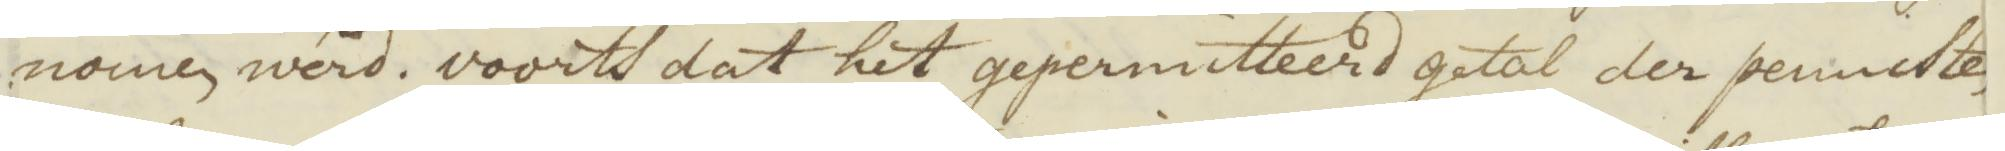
nomen werd. voorts dat het gepermitteerd getal der penniste
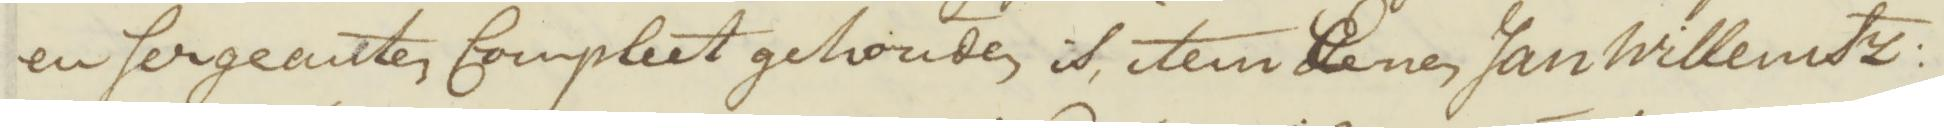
en sergeanten Compleet gehouden is, item Eenen Jan Willemsz:
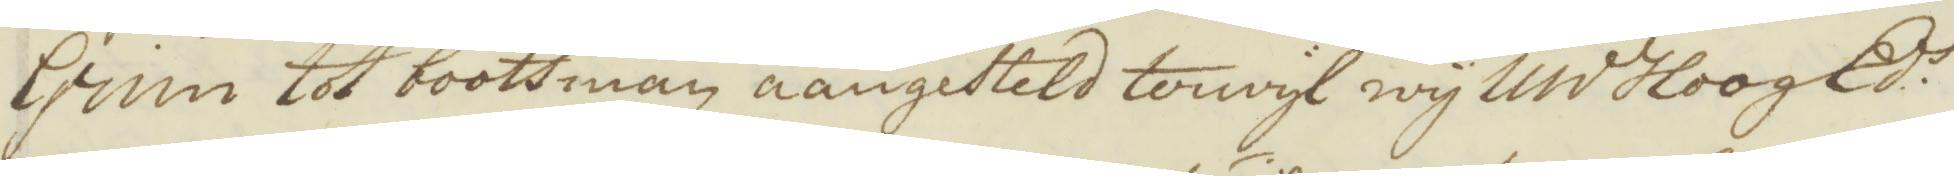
Grim tot bootsman aangesteld terwijl wij Uw Hoog Ed:s
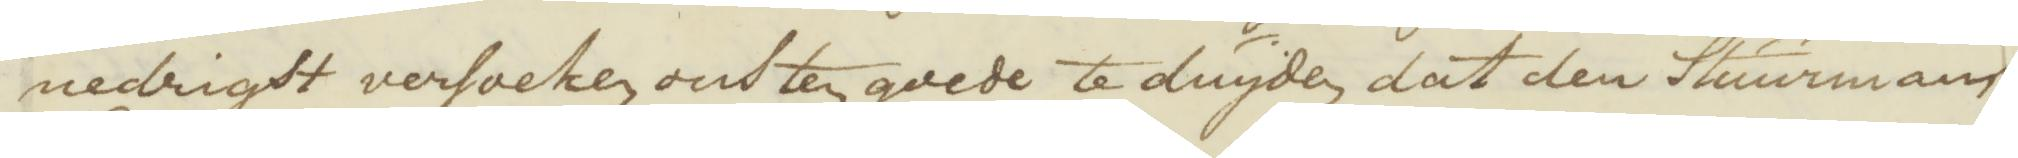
nedrigst versoeken ons ten goede te duijden dat den stuurman
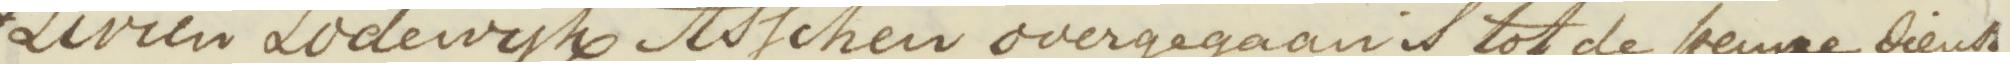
Livien Lodewijk Asschen overgegaan is tot de penne diens
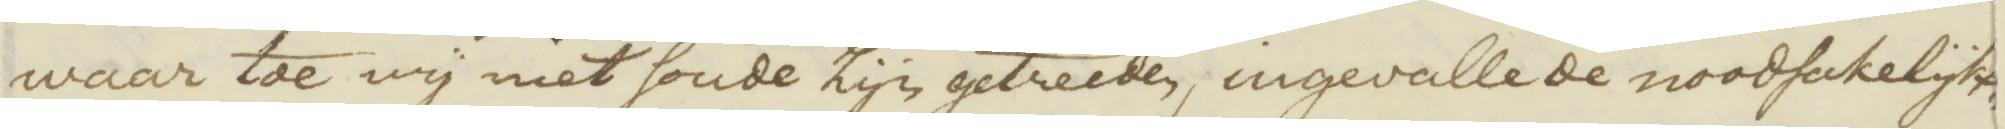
waar toe wij niet soude zijn getreeden, ingevalle de noodsakelijk
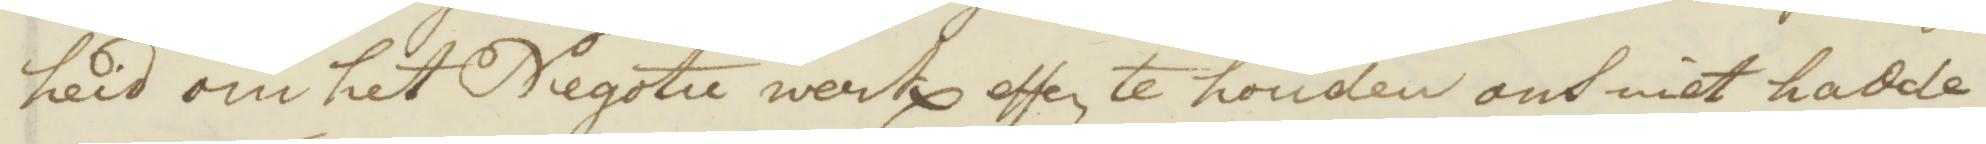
heid om het Negotie werk effen te houden ons niet hadde
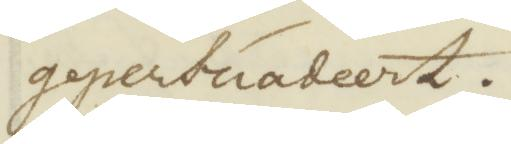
gepersuadeert.
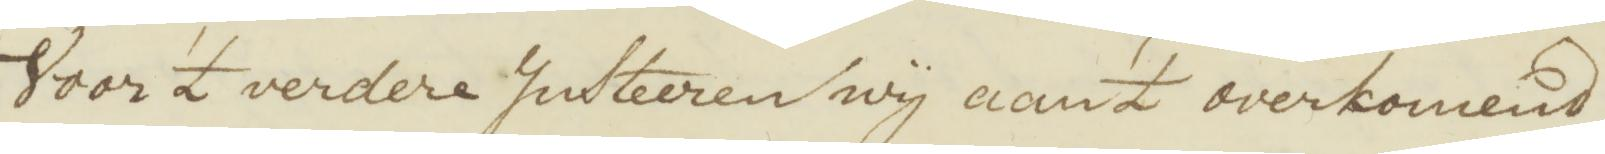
Voor ’t verdere Jnsteeren wij aan ’t overkomend
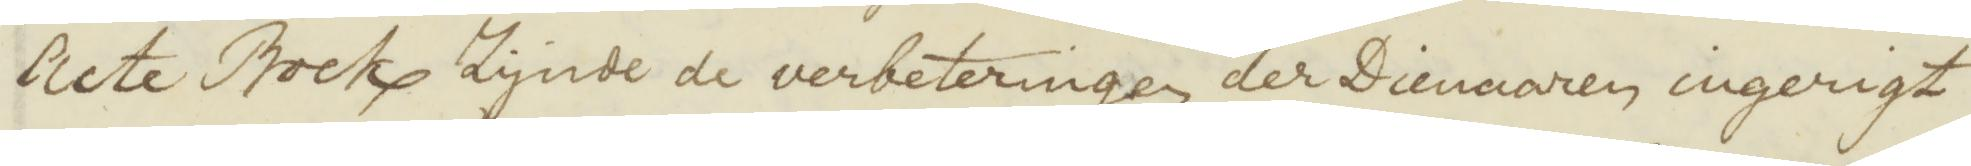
Acte Boek zijnde de verbeteringen der Dienaaren ingerigt
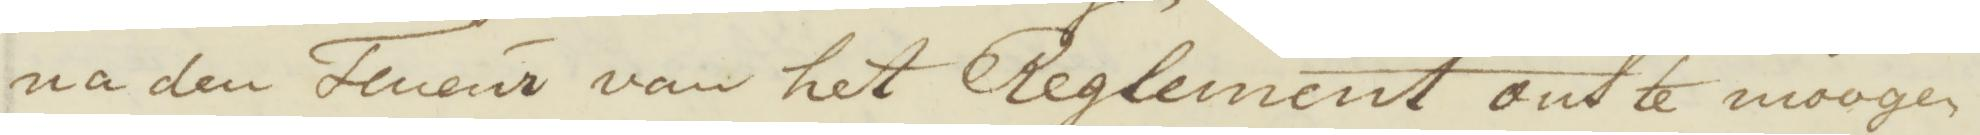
na den Teneur van het Reglement ons te moogen
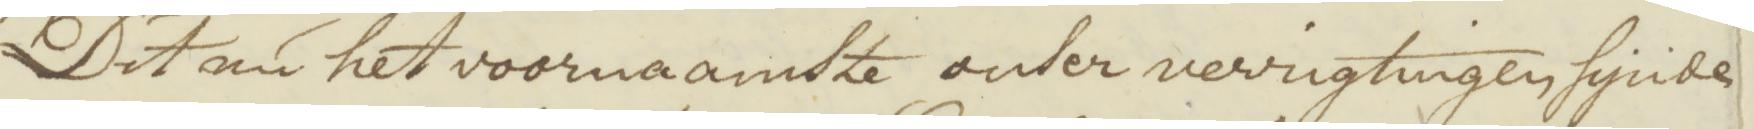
Dit nu het voornaamste onser verrigtingen sijnde
